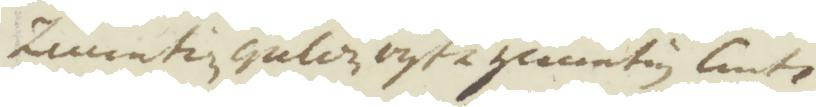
Zeventien gulden vyf en zeventig Cents
